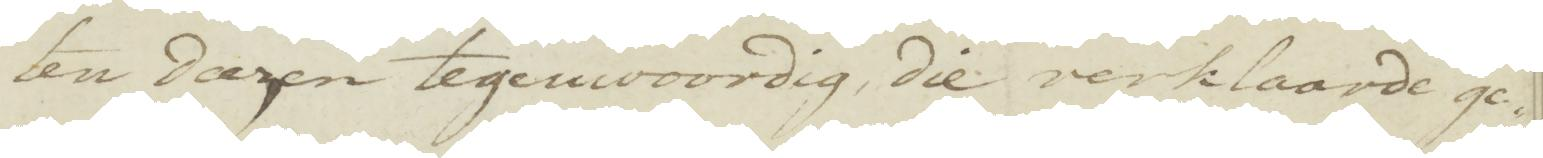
ten deezen tegenwoordig, die verklaarde ge„
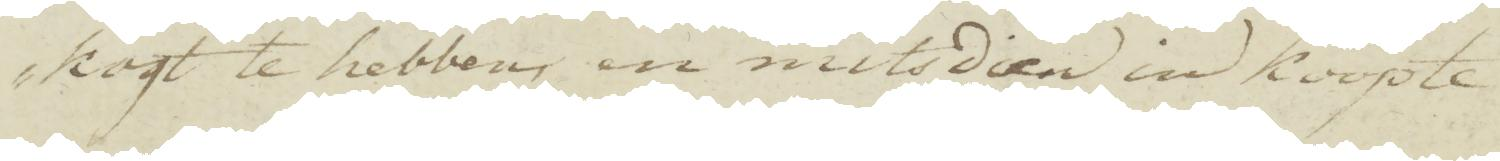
„kogt te hebben en mitsdien in koop te
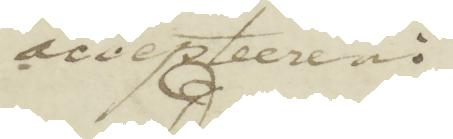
accepteeren:
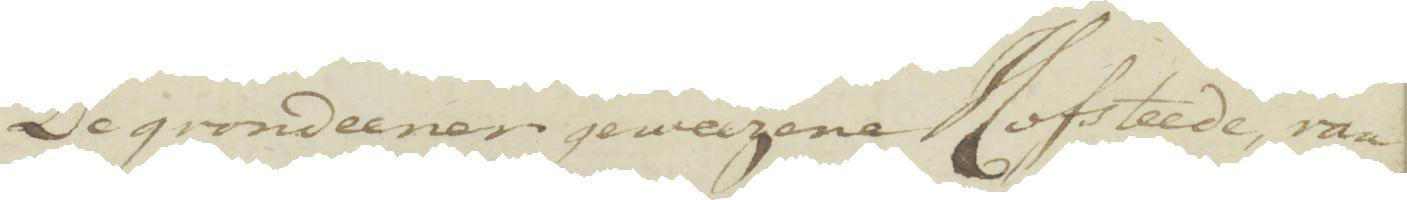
De grond eenen geweezene Hofsteede, van
